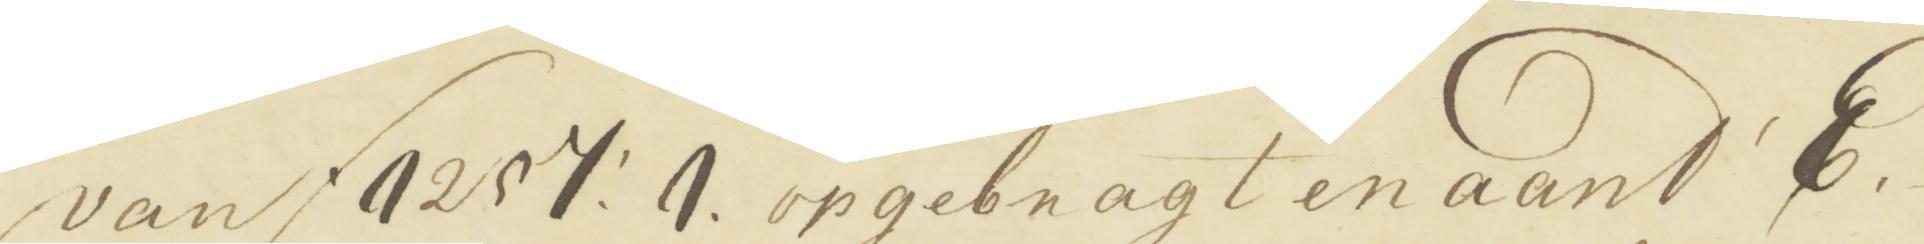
van ƒ4257: 4. opgebragt en aan d’E.
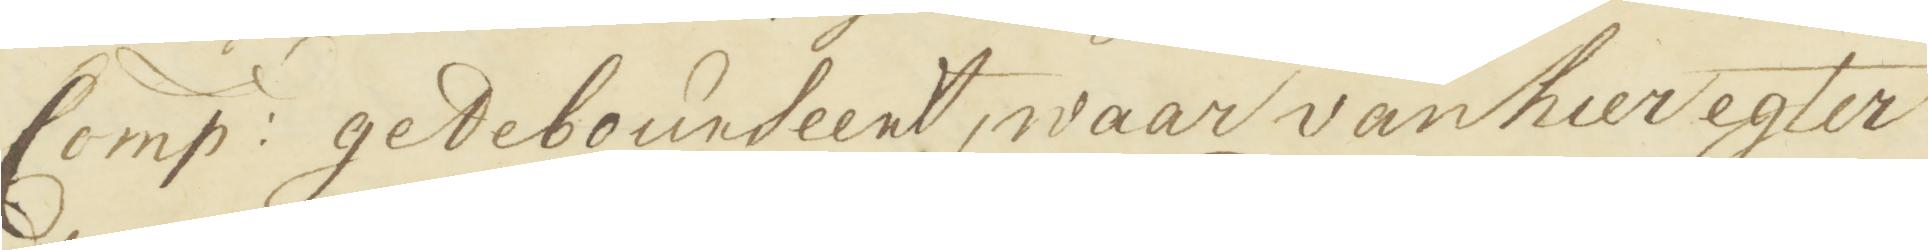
Comp: gedebourseert, waar van hier egter
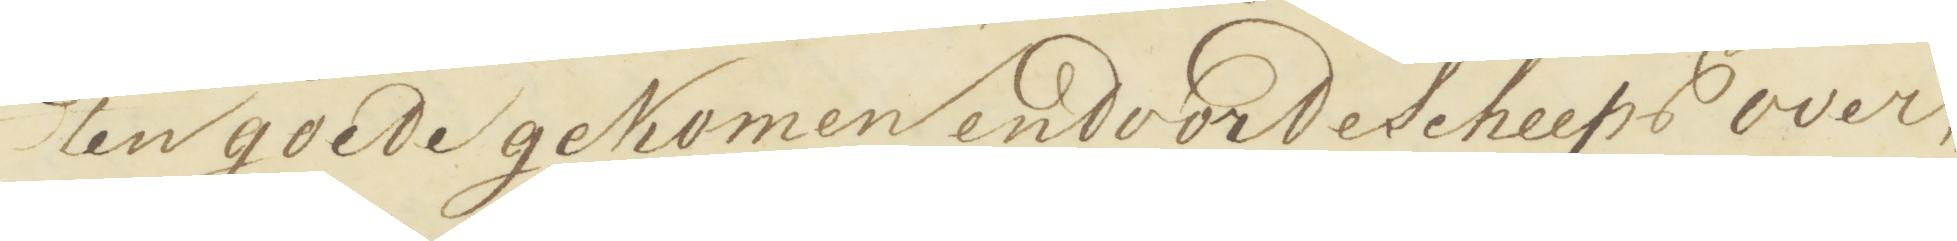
ten goede gekomen en door de scheeps over„
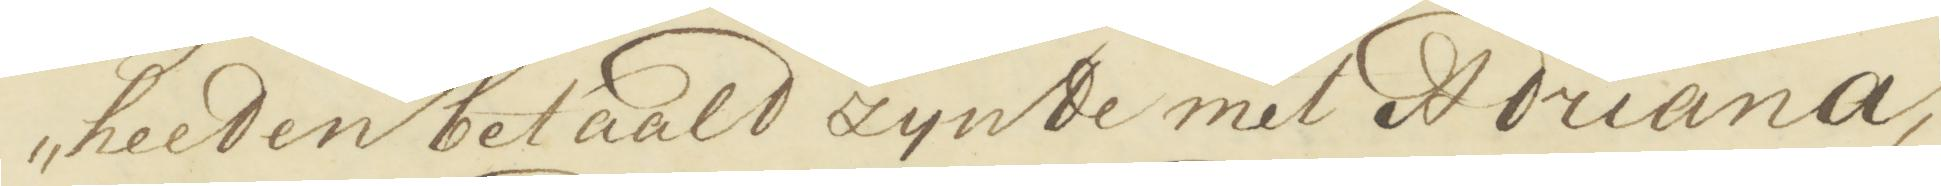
„heeden betaald zijnde met Adriana,
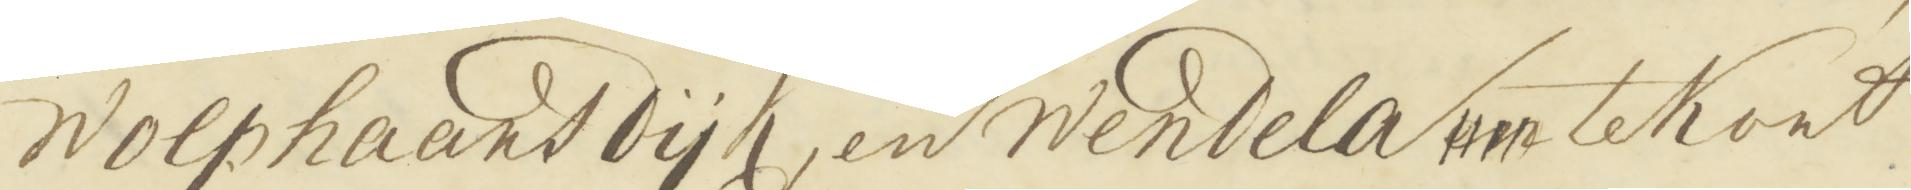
wolphaarsdijk, en wendela en tekort
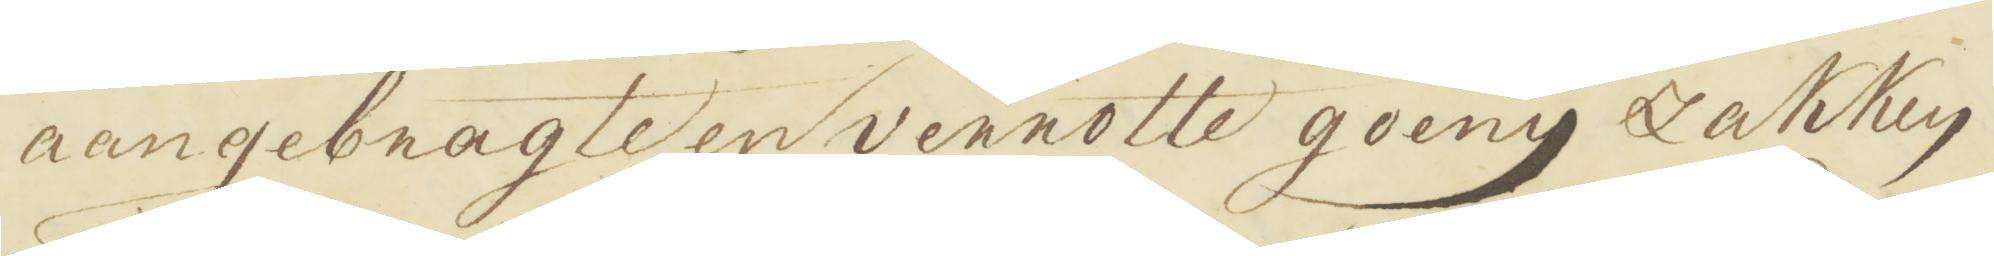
aangebragte en verrotte goenij zakken
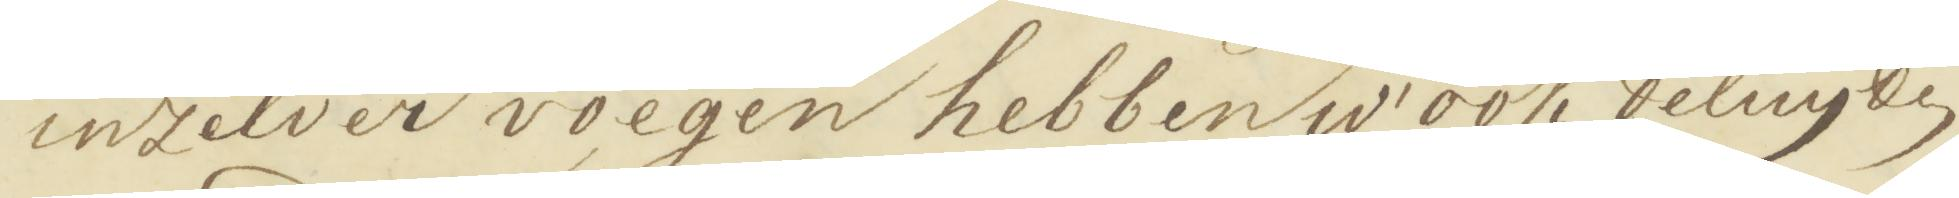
inzelver voegen hebben w'ook deluyden
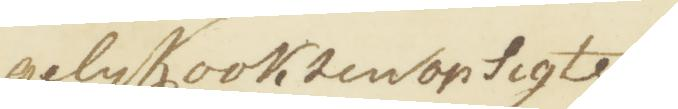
gelyk ook ten opsigte
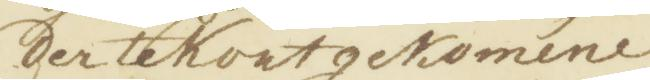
der tekort gekomene
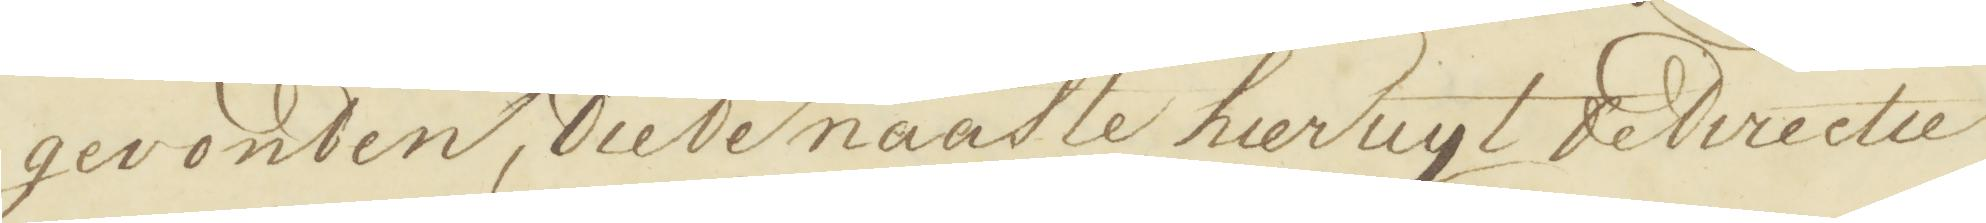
gevonden, die de naaste hier uijt de directie
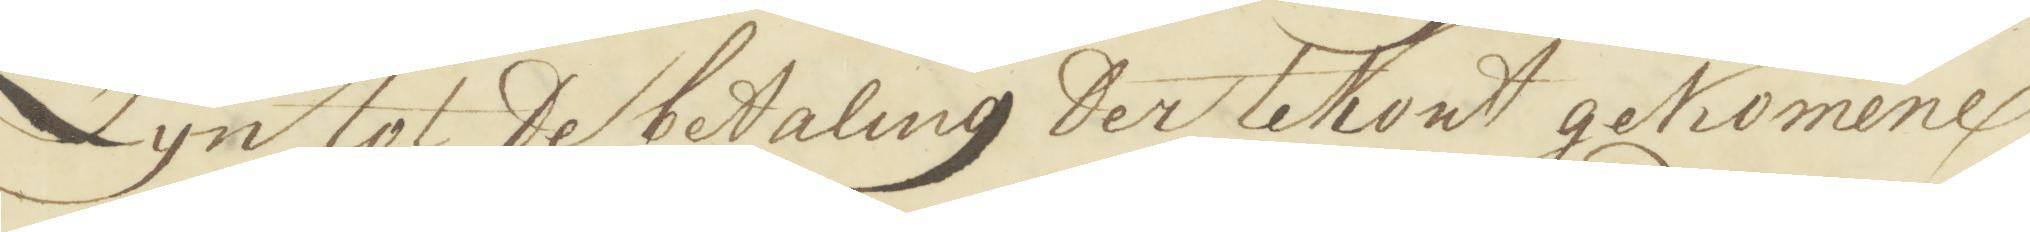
zijn tot de betaling der tekort gekomene,
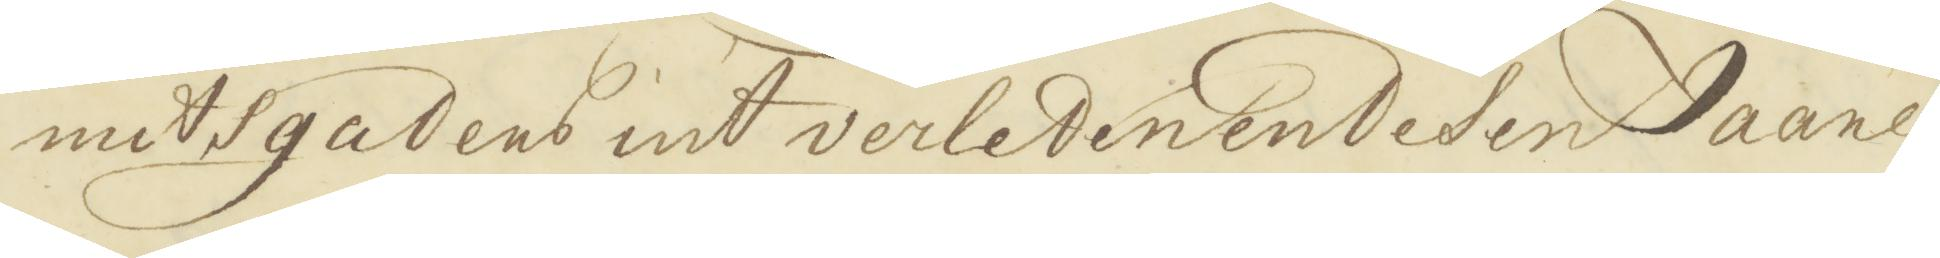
midsgaders in’t verleden en desen Iaare
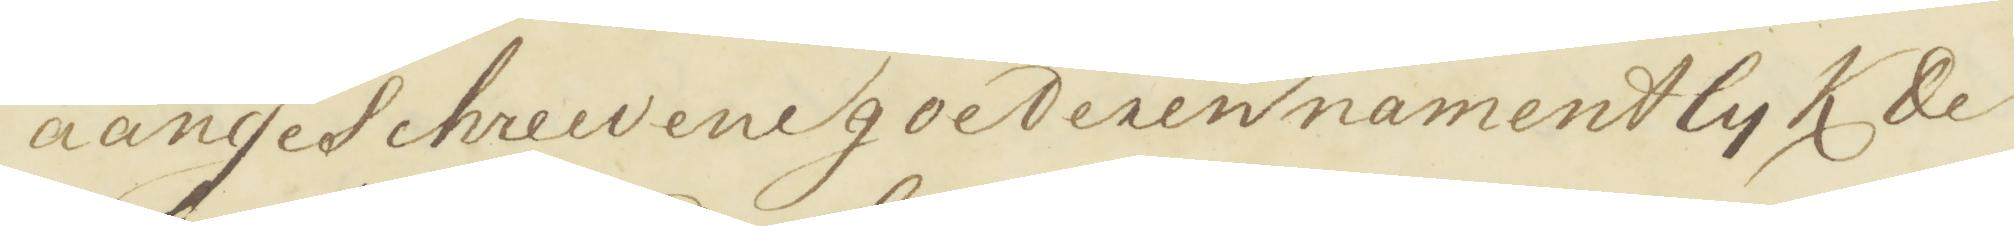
aangeschreevene goederen namentlyk de
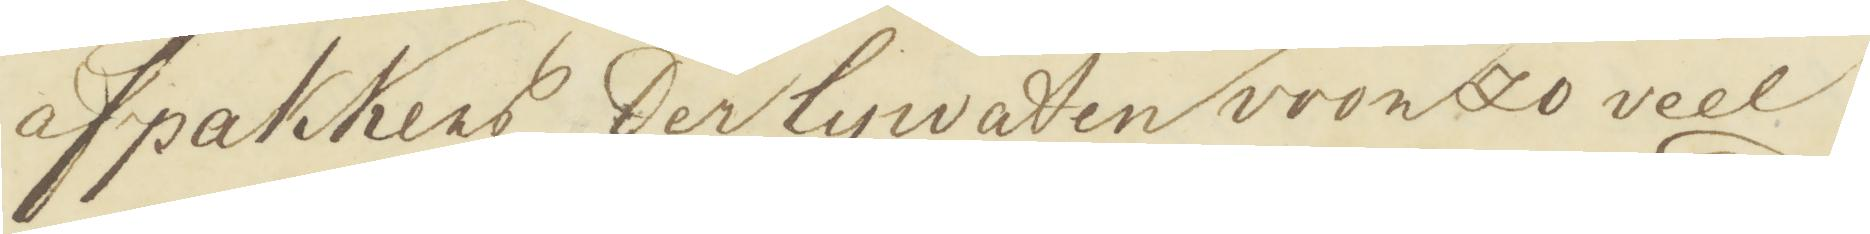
afpakkers der lywaten voor zo veel
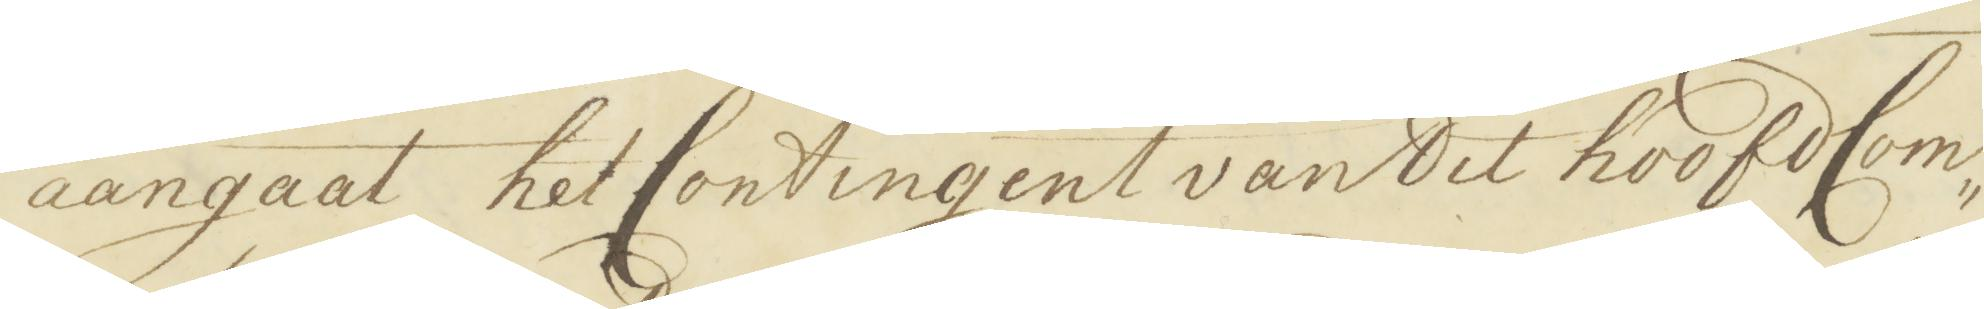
aangaat het Contingent van dit hoofd Com„
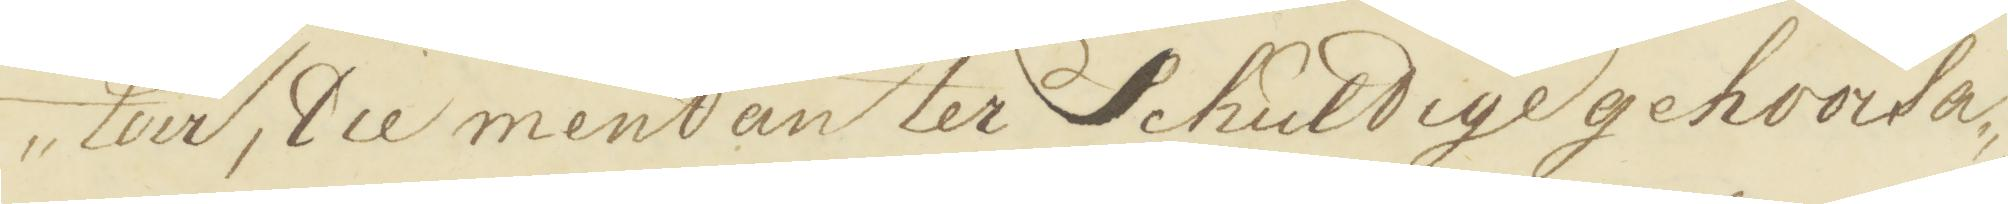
„toir, die men dan ter schuldige gehoorsa„
